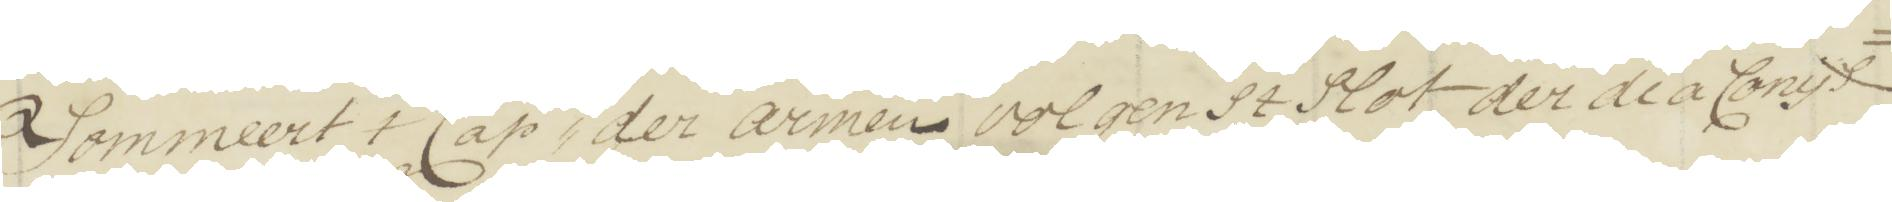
Sommeert t cap„l der armen volgens t slot der diaconijs
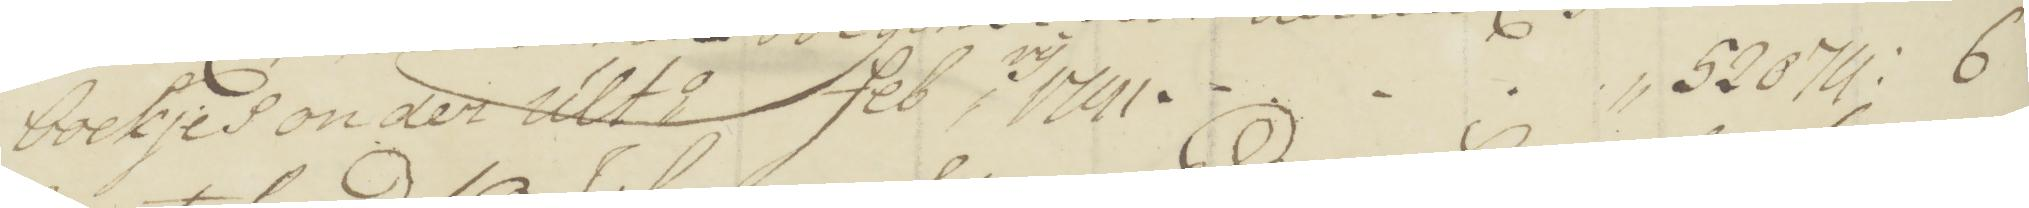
boekjes on der ult=o feb „rij 1741 - - - „ 52074: 6
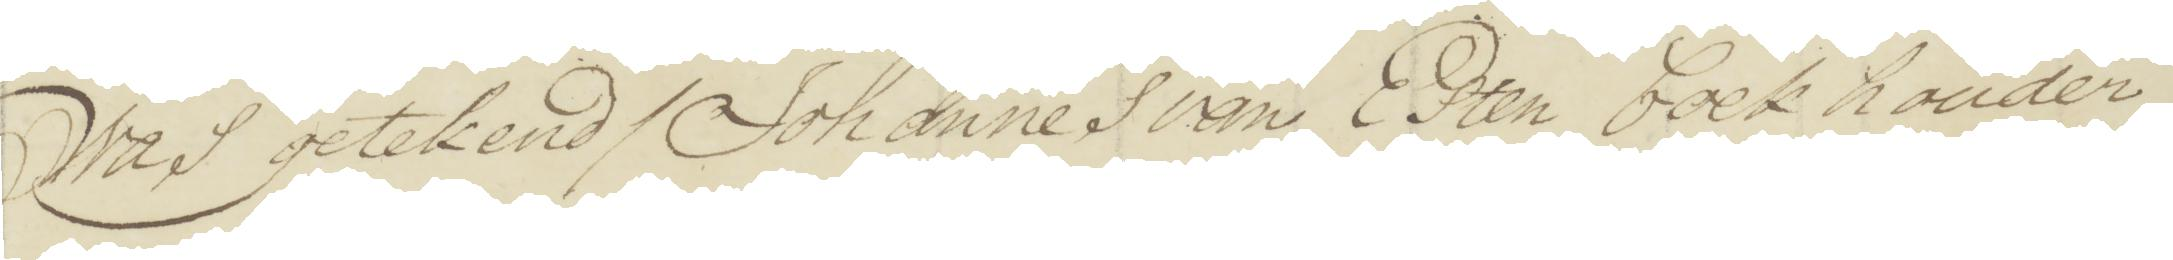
Was getekend/ Joh annes van Esten boek houder
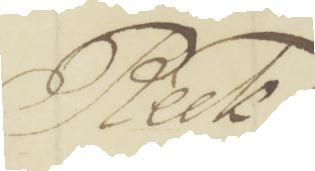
Reek,
